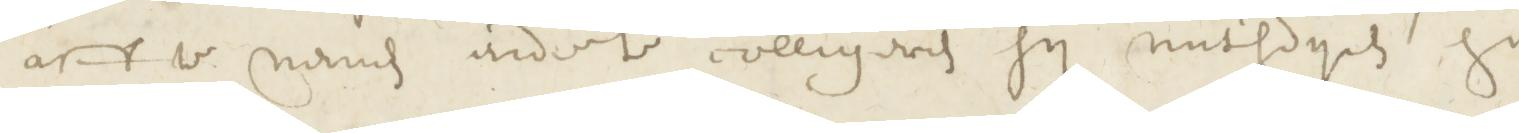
aff te nemen ende te colligeren sy mitsdyen, hy
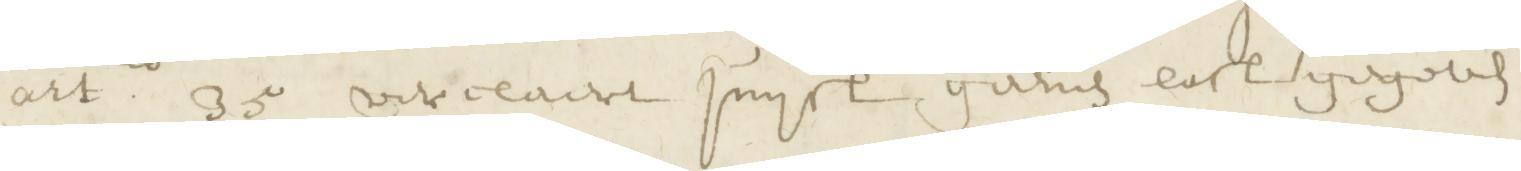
art.lo 35 verclaert juyst geenen last gegeven
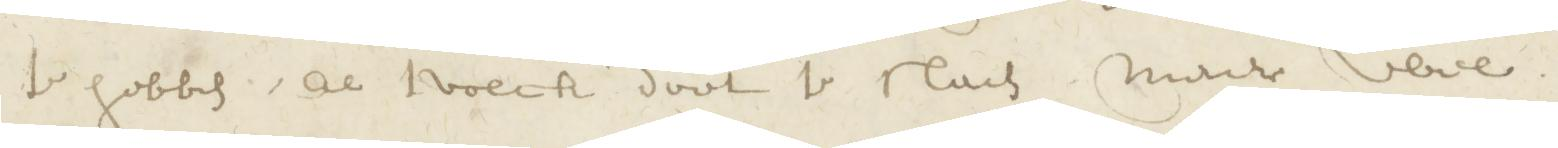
te hebben, de tvolck doot te slaen maer wel
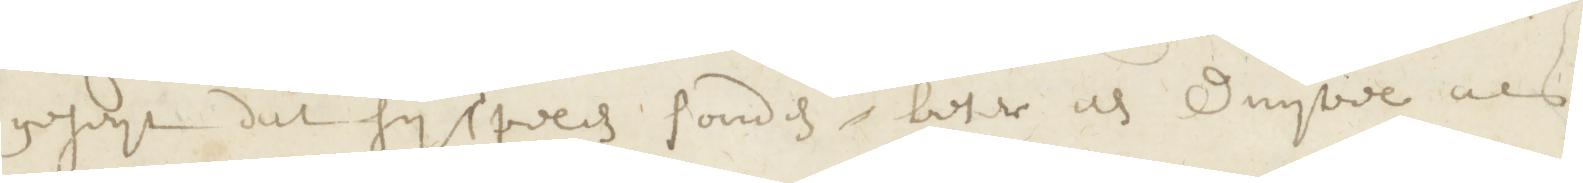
geseyt dat sy spelen souden beter een duyvel als
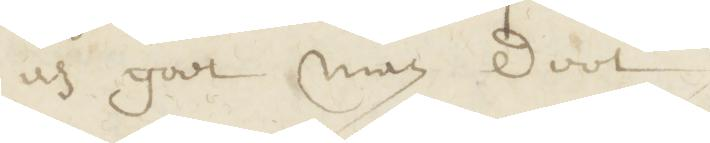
een goet man doot
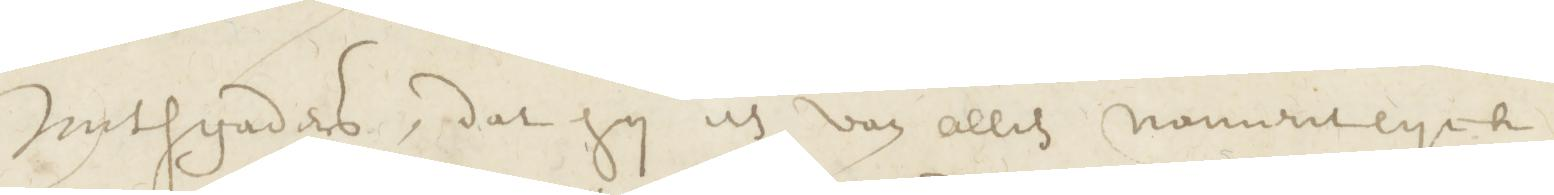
mitsgaders, dat hy een van allen namentlyck
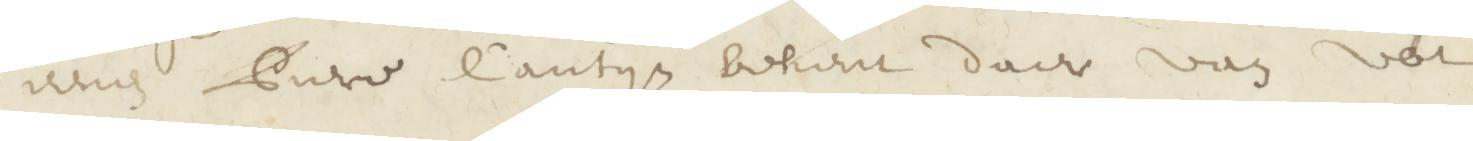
eenen Piere Cantyn bekent daer van wt
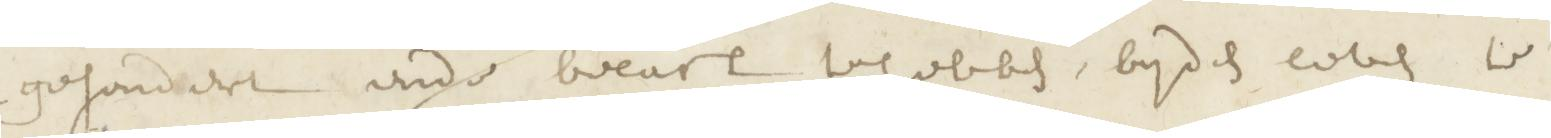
gesondert ende belast te hebben, by den leven te
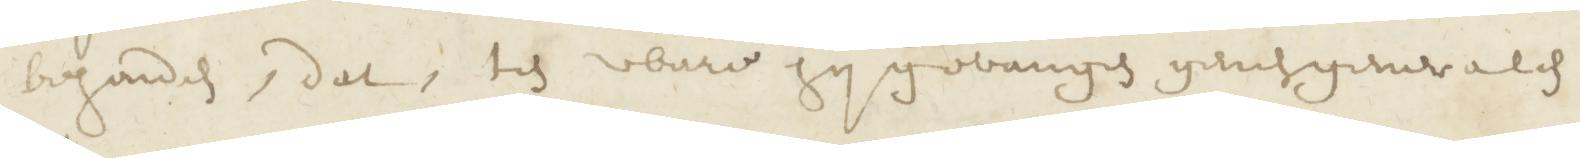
behouden, dat, ten ware hy gevangen genegener al een
